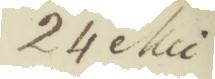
24 Mei
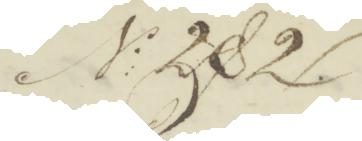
N: 282
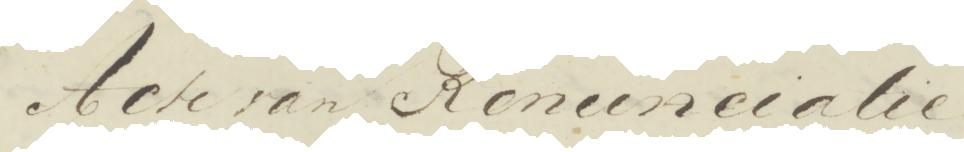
Acte van Renunciatie
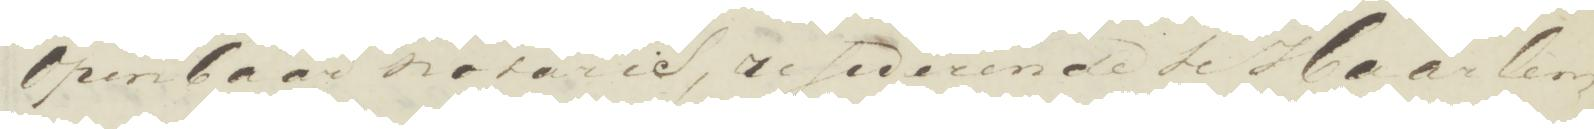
Openbaar notaris, residerende te Haarlem
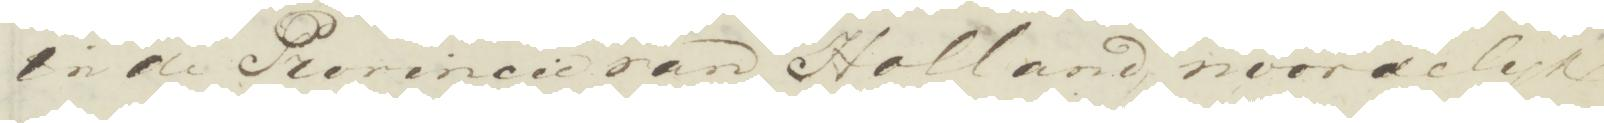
in de Provincie van Holland, noordelyk
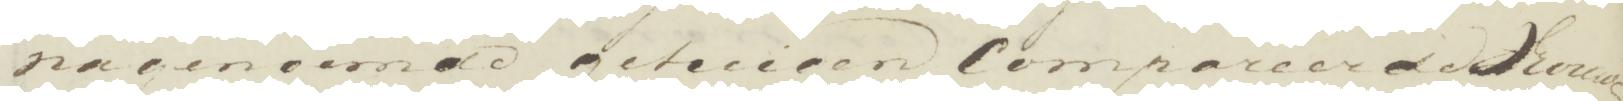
na genoemde getuigen Compareerde Vrouwe
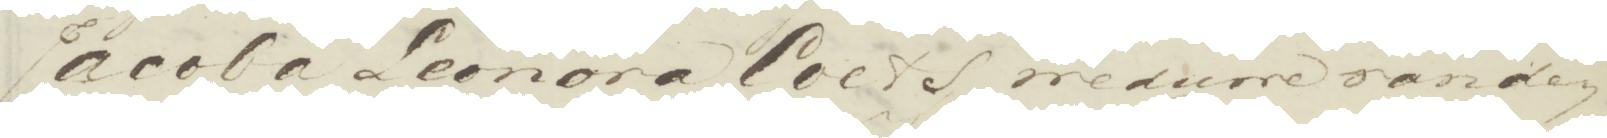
Jacoba Leonora Coets weduwe van den
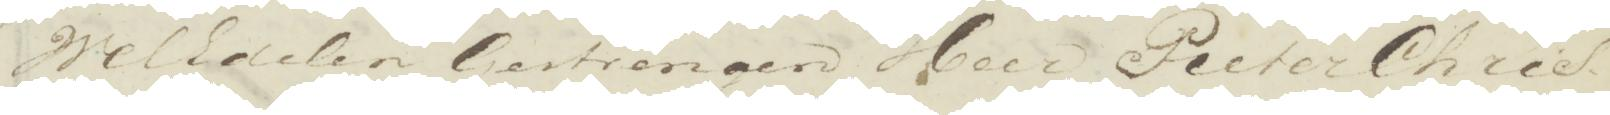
Wel Edelen Gestrengen Heer Pieter Chris
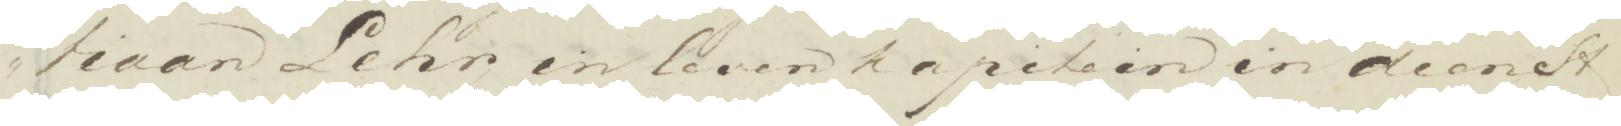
„tiaan Lehr in leven kapitein in dienst
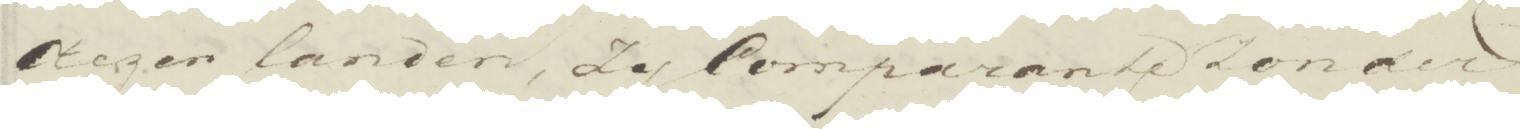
dezer landen, zy Comparante zonder
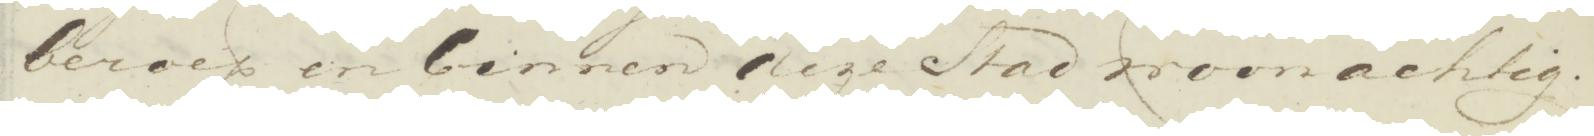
beroep en binnen deze Stad woonachtig.
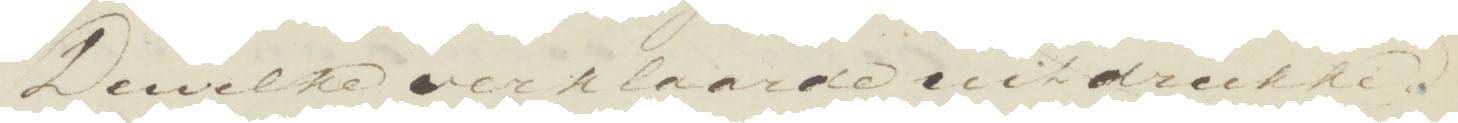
Dewelke verklaarde uitdrukke
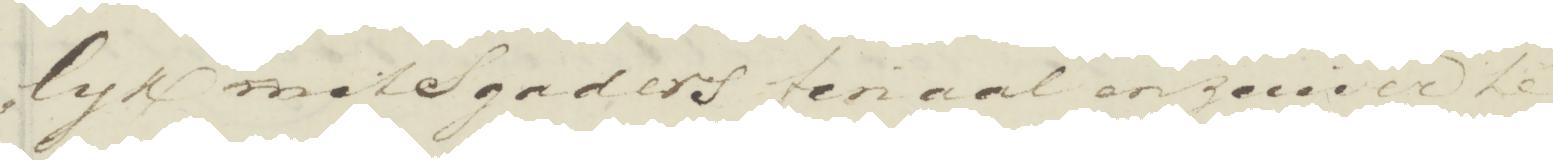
„lyk mitsgaders finaal en zuiver te
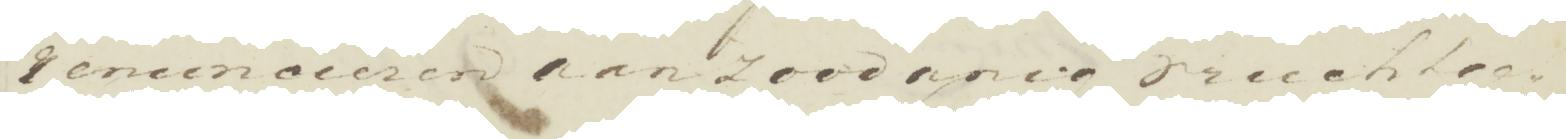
renunceeren aan zoodanig vruchtge
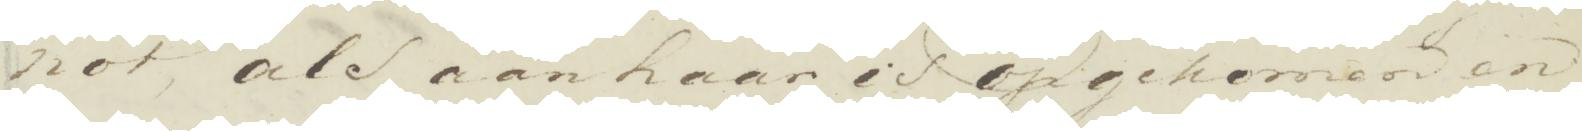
not als aan haar is opgekomen en
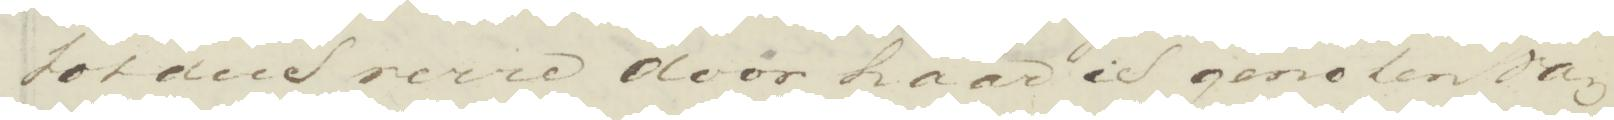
tot dus verre door haar is genoten van
